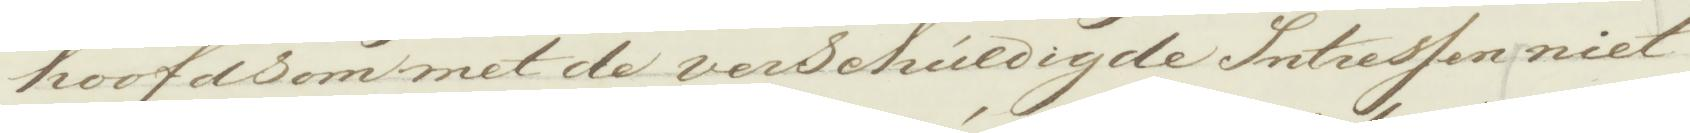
hoofdsom met de verschuldigde Intressen niet
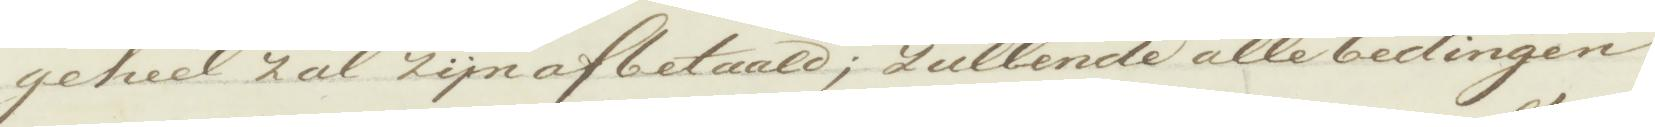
geheel zal zijn afbetaald; zullende alle bedingen
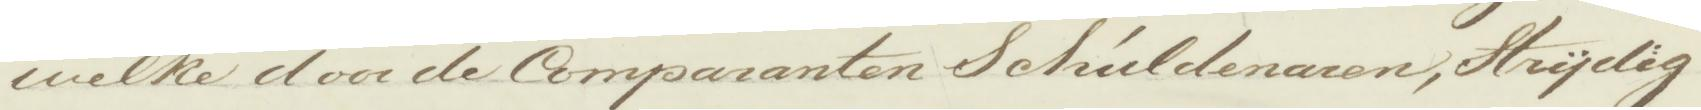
welke door de Comparanten Schuldenaren, strijdig
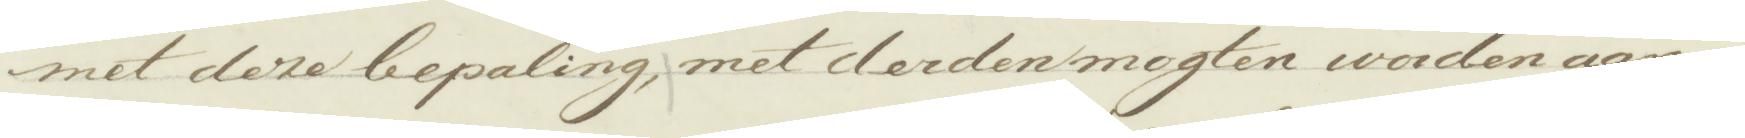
met deze bepaling, met derden mogten worden aan
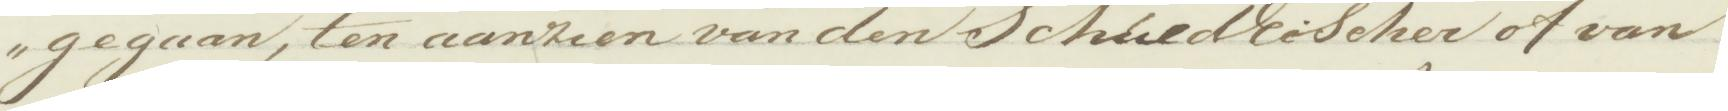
„gegaan, ten aanzien van den Schuldeischer of van
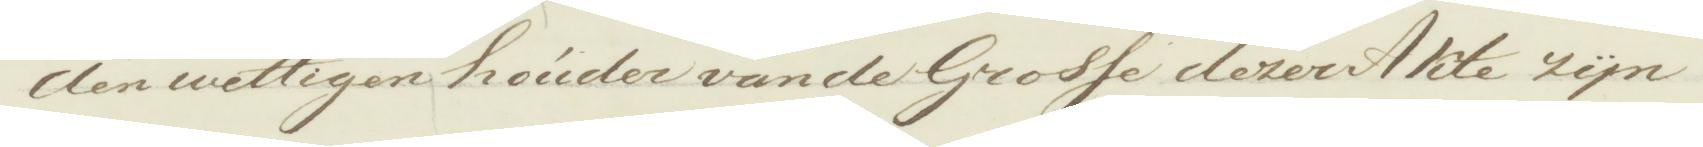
den wettigen houder van de Grosse dezer Akte zijn
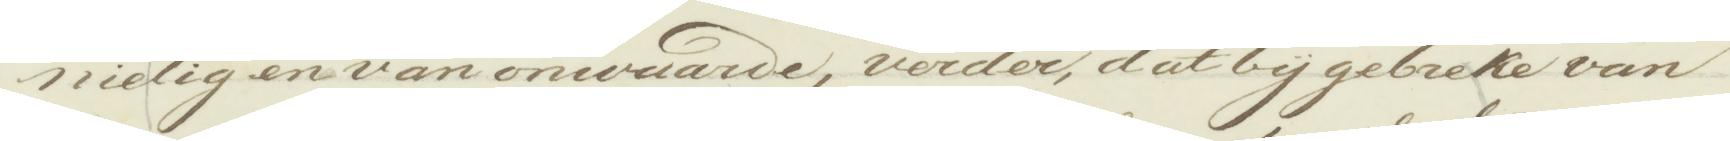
nietig en van onwaarde, verder, dat bij gebreke van
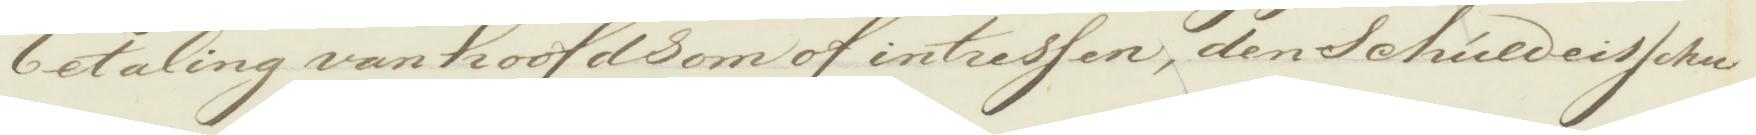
betaling van hoofdsom of intressen, den Schuldeisscher
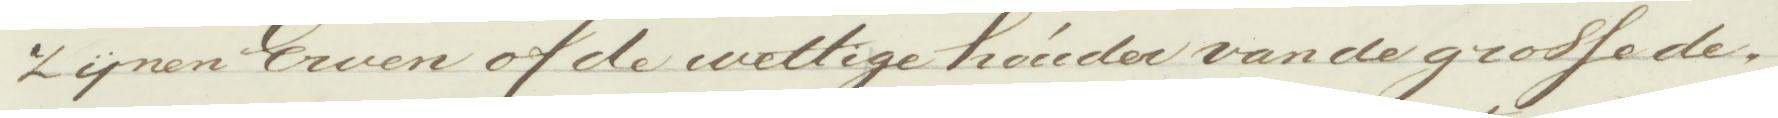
zijnen Erven of de wettige houder van de grosse de„
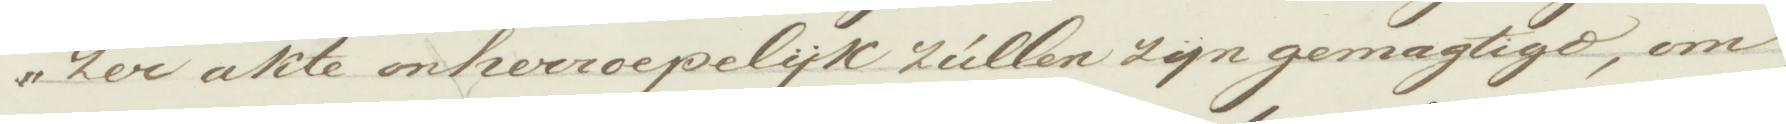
„zer akte onherroepelijk zullen zijn gemagtigd, om
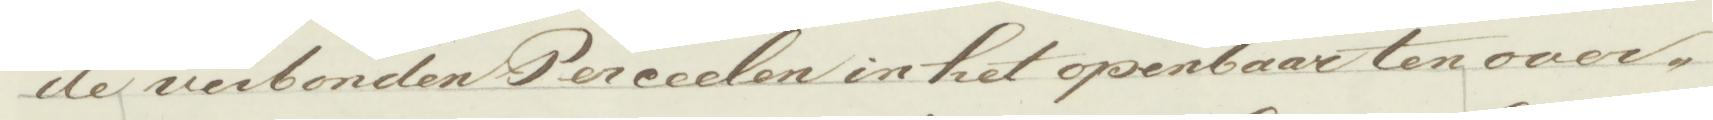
de verbonden Perceelen in het openbaar ten over„
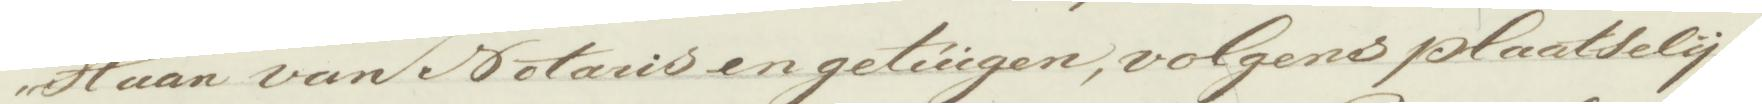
„staan van Notaris en getuigen, volgens plaatselij
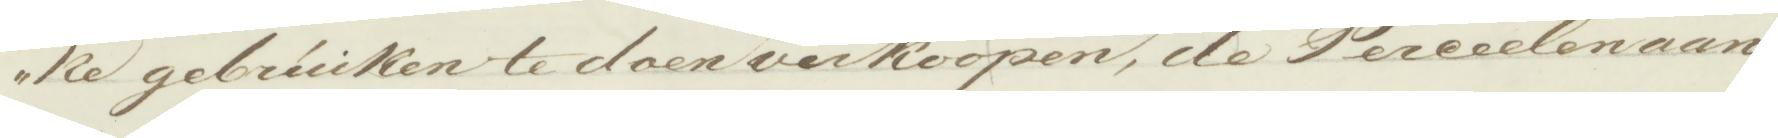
„ke gebruiken te doen verkoopen, de Perceelen aan
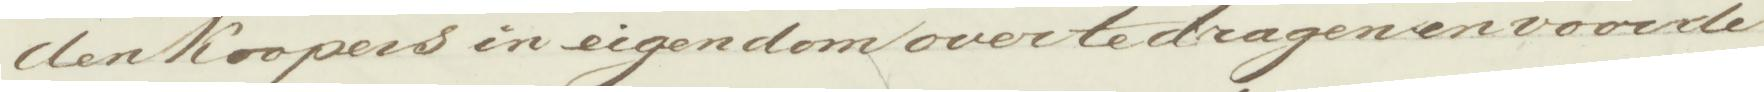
den Koopers in eigendom over te dragen en voor de
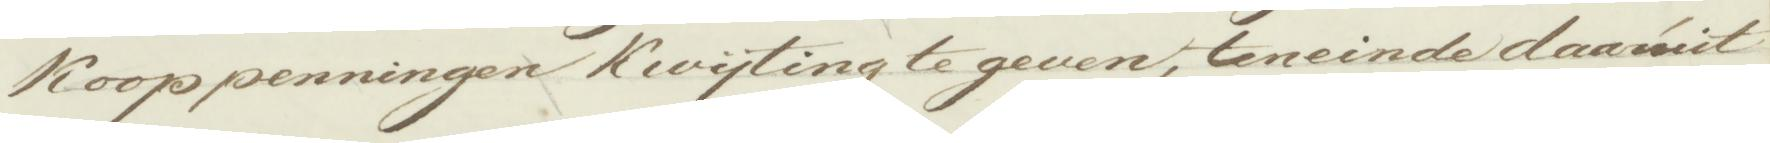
kooppenningen kwijting te geven, ten einde daaruit
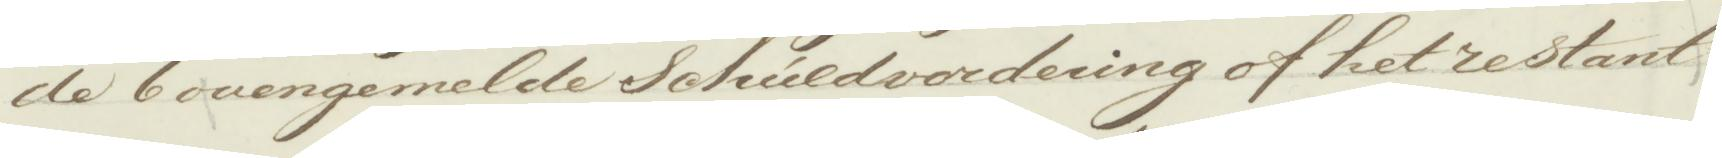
de bovengemelde schuldvordering of het restant
